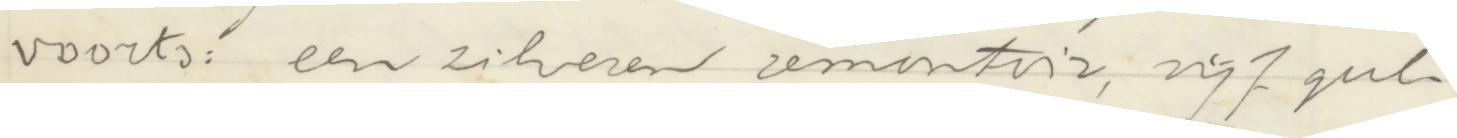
voorts: een zilveren remontoir, vijf gul-
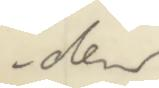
-den
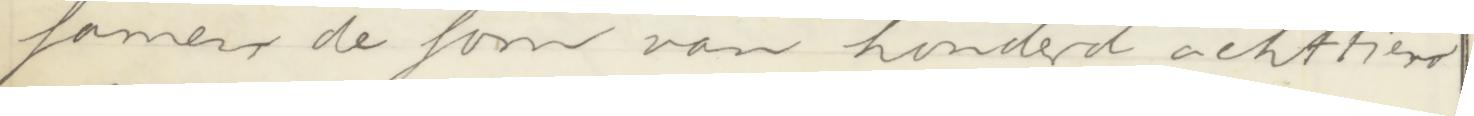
samen de som van honderd achttien
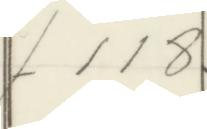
ƒ 118
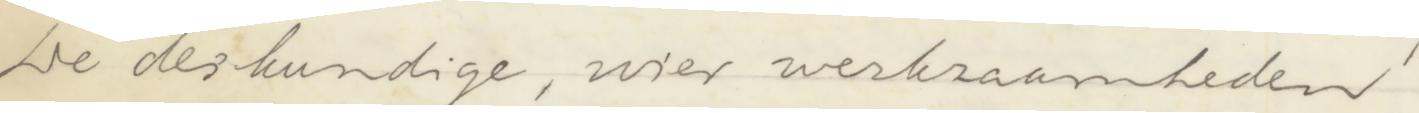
De deskundige, wier werkzaamheden
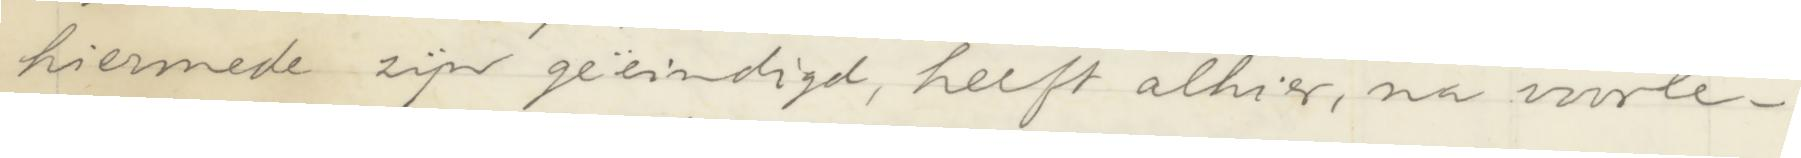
hiermede zijn geëindigd, heeft alhier, na voorle-
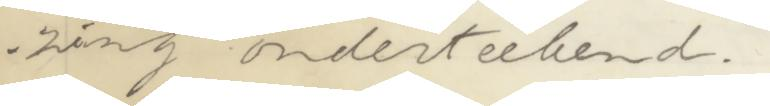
-zing onderteekend.
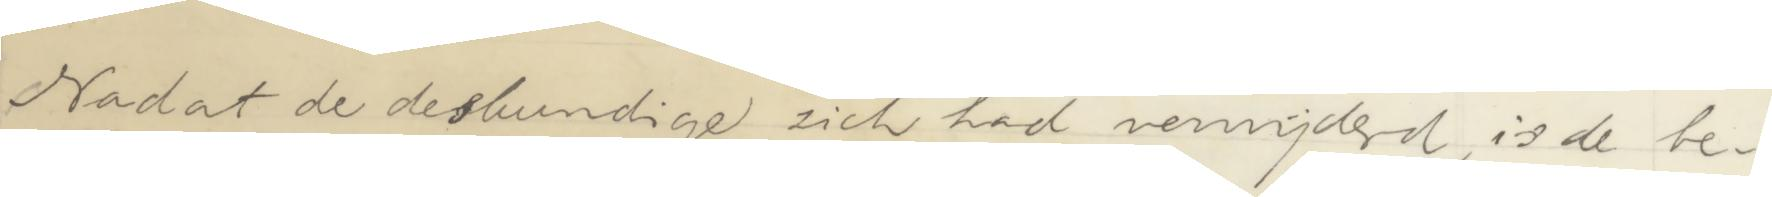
Nadat de deskundige zich had verwijderd, is de be-
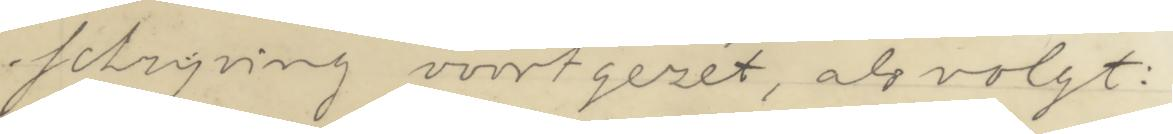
-schrijving voort gezet, als volgt:
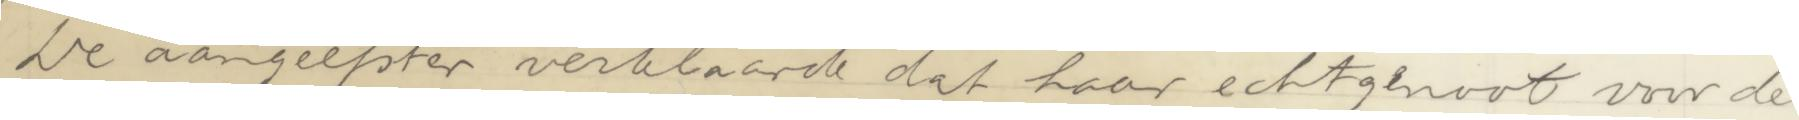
De aangeefster verklaarde dat haar echtgenoot voor de
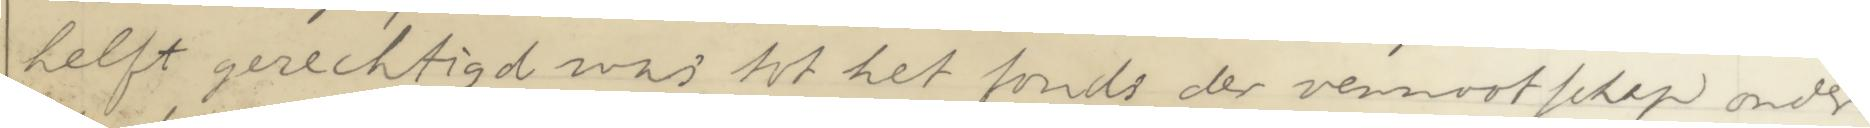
helft gerechtigd was tot het fonds der vennootschap onder
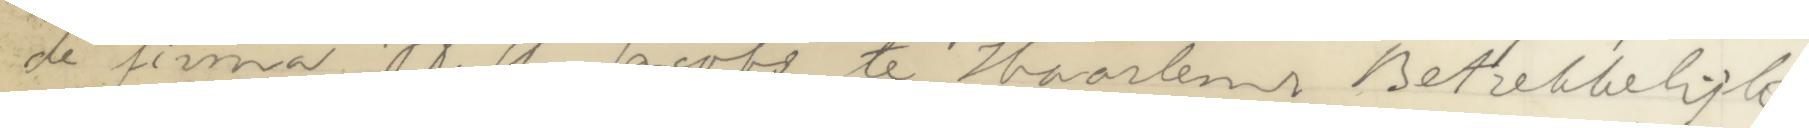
de firma W. H. Jacobs te Haarlem, Betrekkelijk
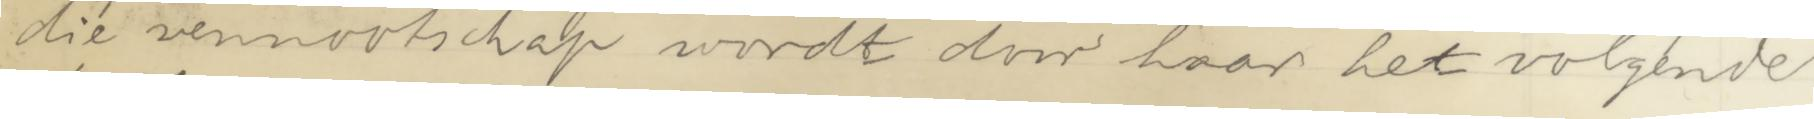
die vennootschap wordt door haar het volgende
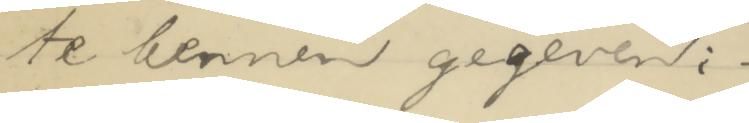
te kennen gegeven:
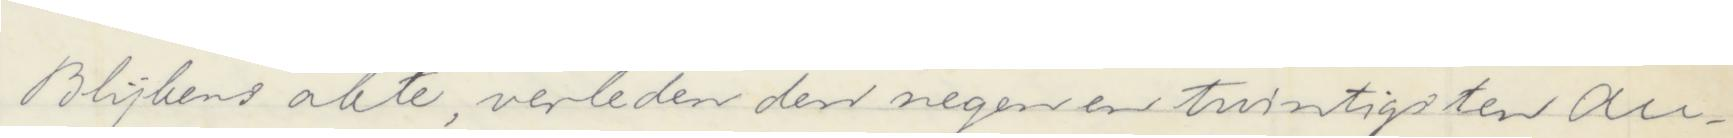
Blijkens akte, verleden der negen en twintigsten Au-
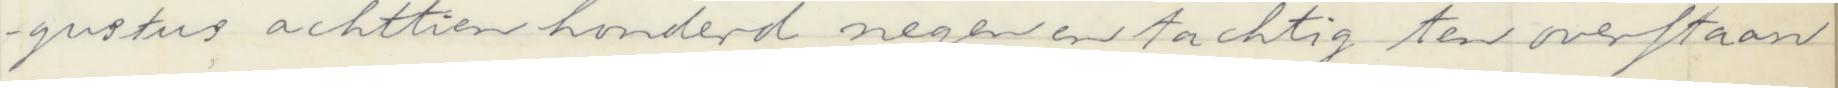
-gustus achttien honderd negen en tachtig ten overstaan
